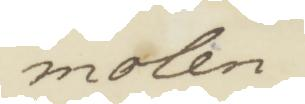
molen
